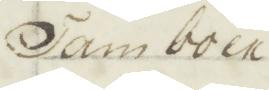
Jamboer
